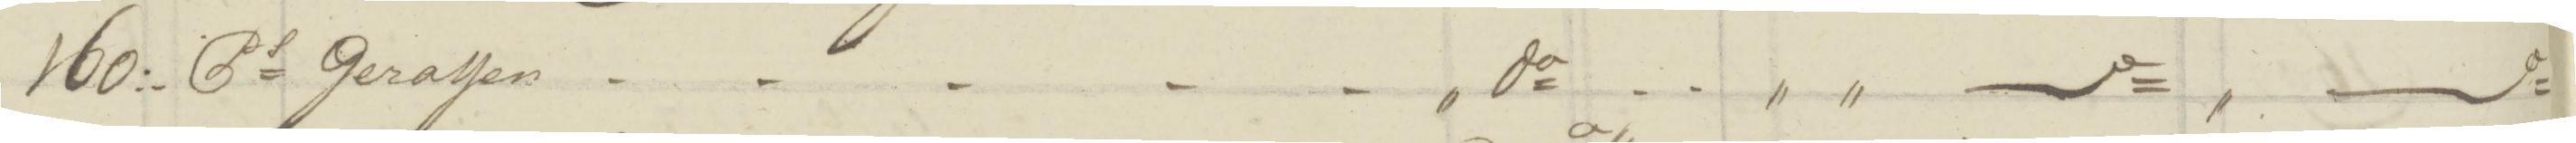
160:- P=s Gerassen - - - - - „d=o - - „ „ _=o „ _=o
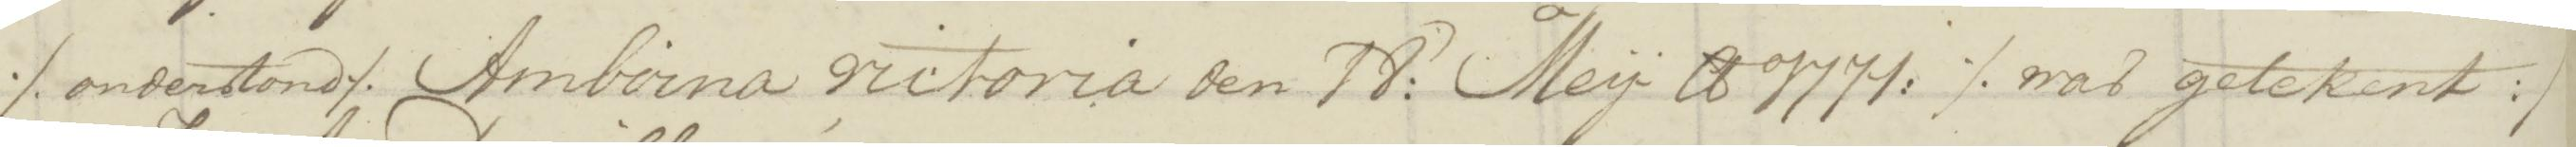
./.onderstond./. Amboina victoria den 18:' Meij Ao 1771: ./.was getekent:/
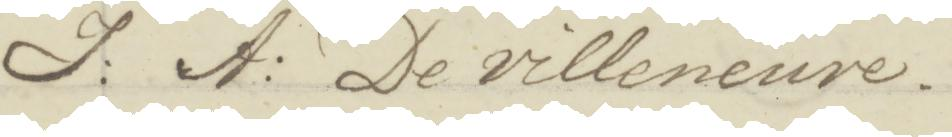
I: A: De villeneuve.
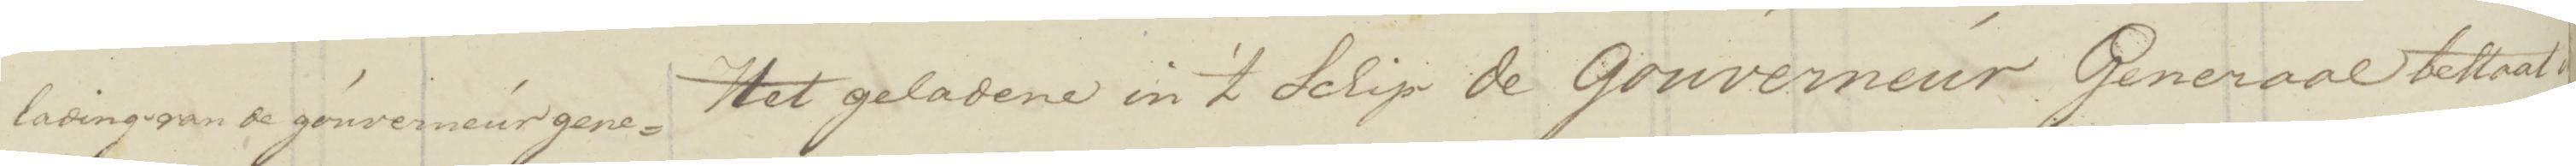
lading van de gouverneur gene= Het geladene in ’t schip de Gouverneur Generaal bestaat
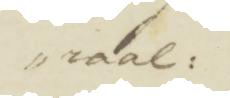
„raal:
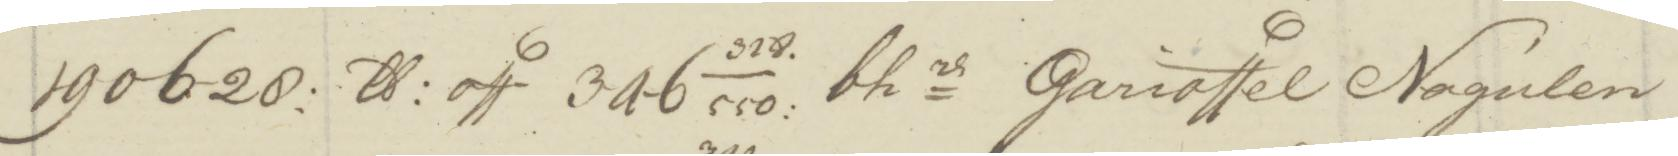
190628: lb: off 346 318./550: bh=rs Garioffel Nagulen,
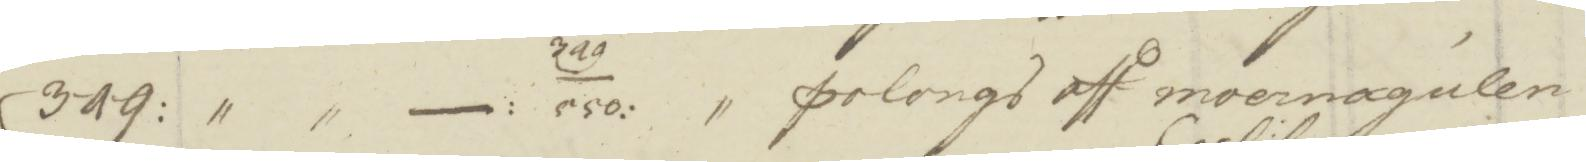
349: „ „ —: 349/550: „ polongs off moernagulen
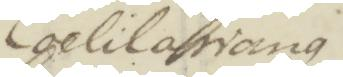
Coelilawang
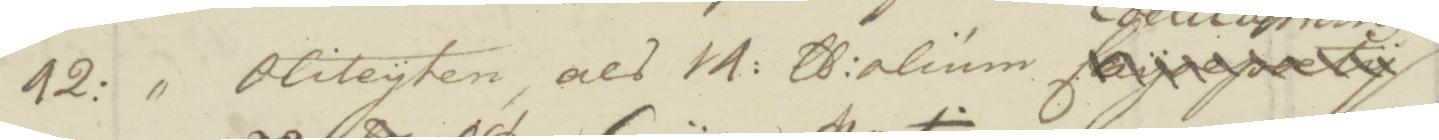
42: oliteijten, als 14: lb: olium caijoepoetij
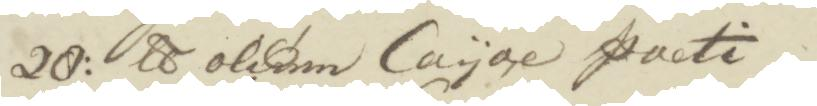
28: lb olium Caijoe poeti
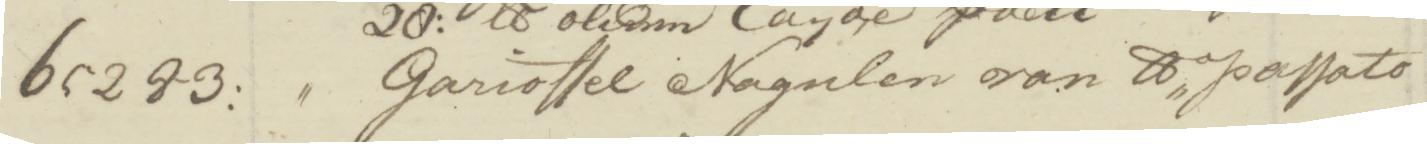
65283: „ Garioffel Nagulen van A„o passato
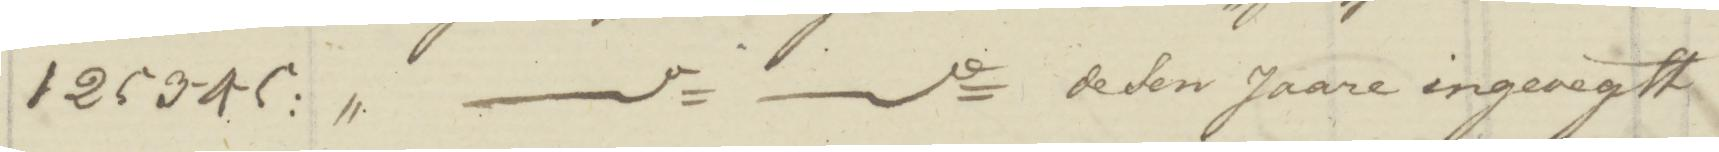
125345: „ _=o _=o desen Jaare ingevegst
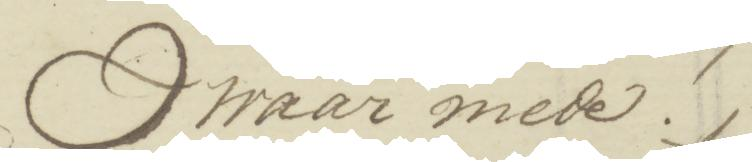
waar mede!
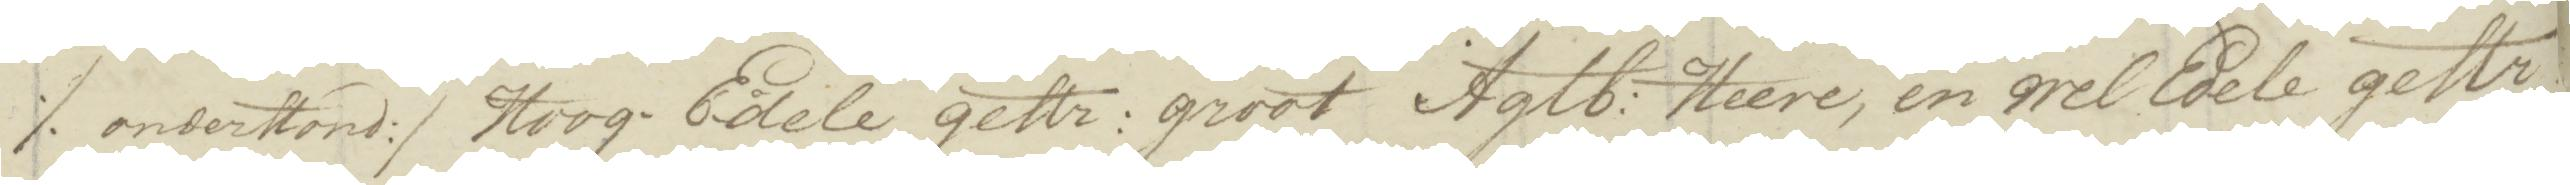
./. onderstond:/ Hoog Edele gestr: groot Agtb: Heere, en wel Edele gestr:
